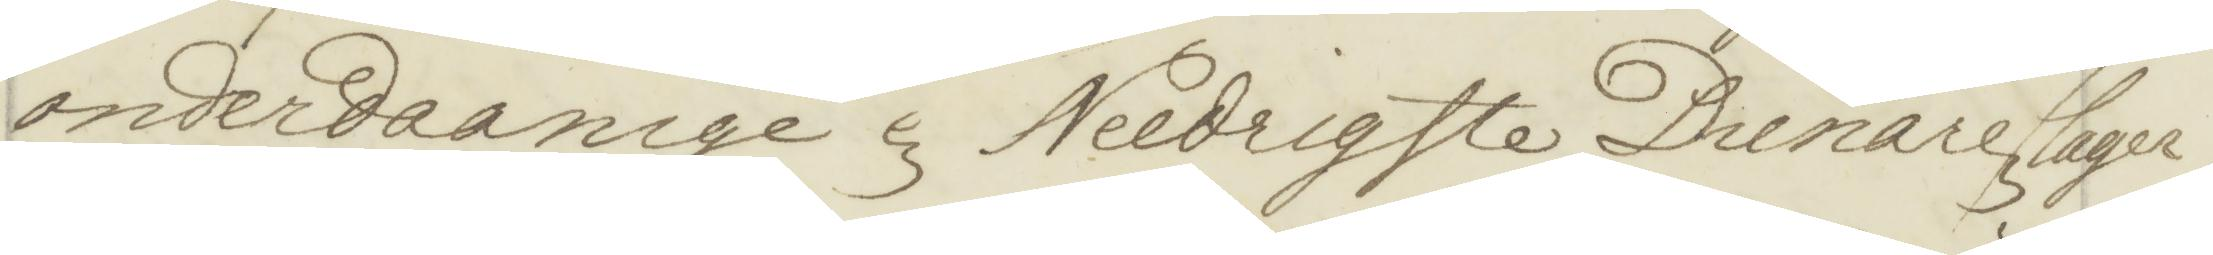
onderdaanige en Needrigste Dienaren /lager/
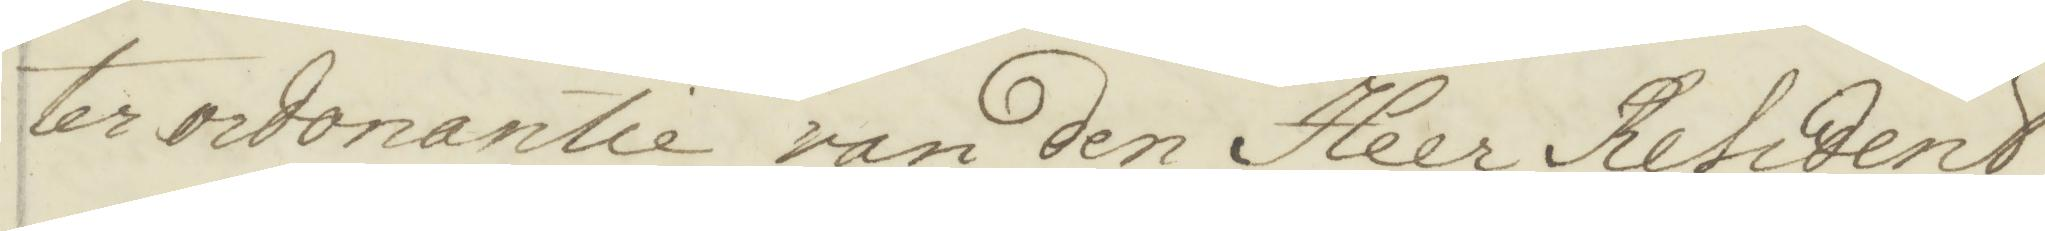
ter ordonantie van den Heer Resident
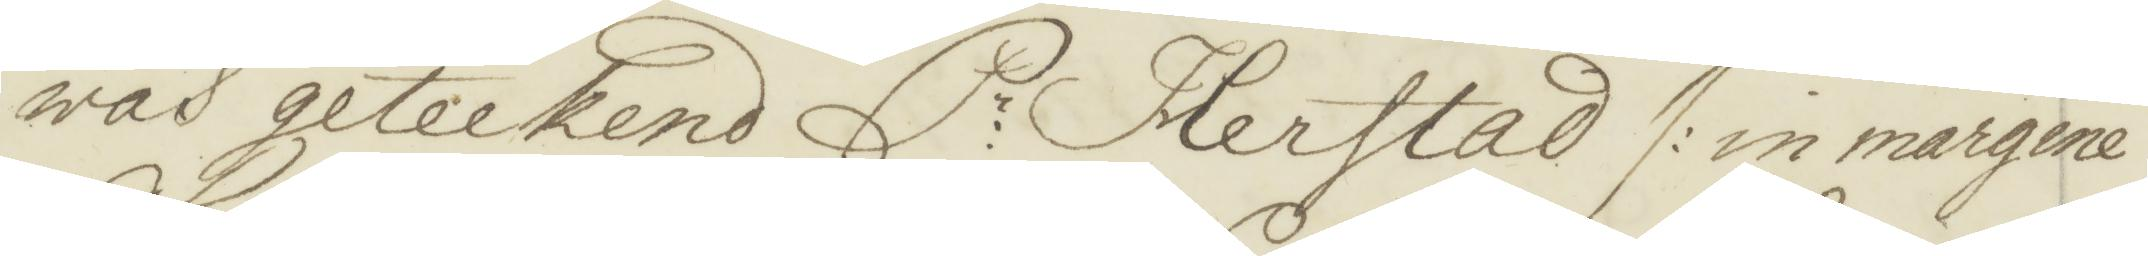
was geteekend P:r Herstad /: in margine
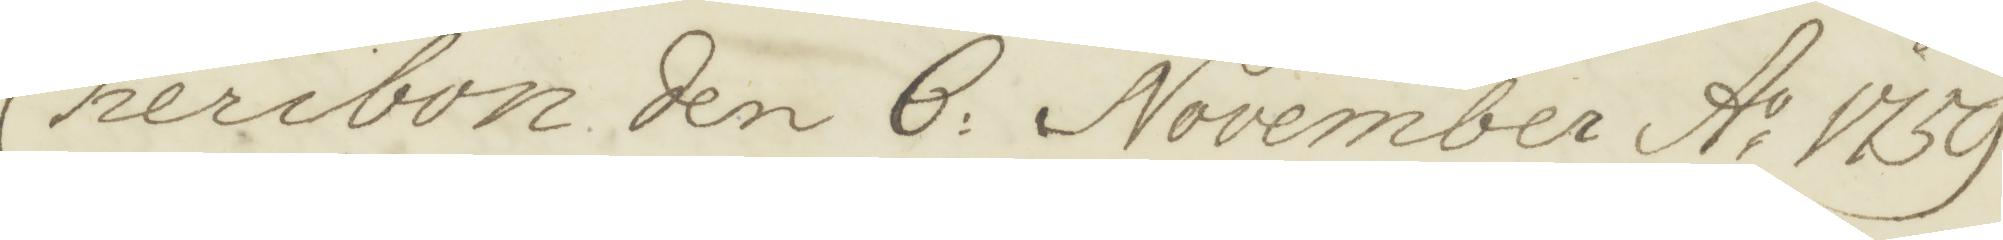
Cheribon den 6: November A„o 1759.
